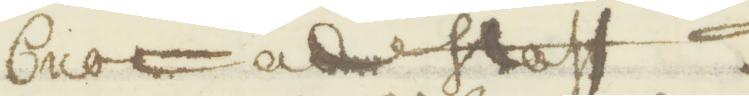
3 brocadestoff
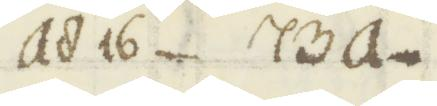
48 16 – 734–
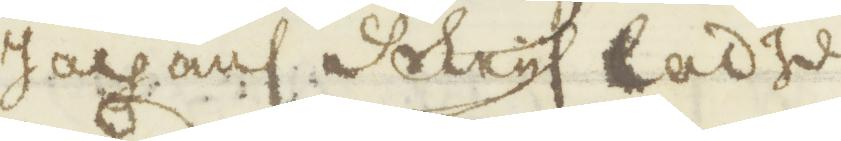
Jaepans Schrijf ladje
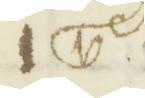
1 ps
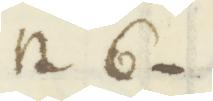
12 6 –
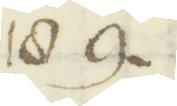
18 9–
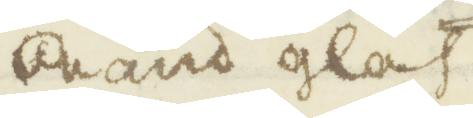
brand glas
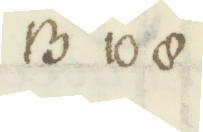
13 10 8
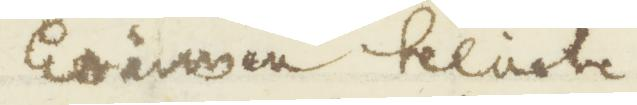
1„ houwer klink
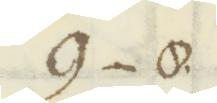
9 – 8.
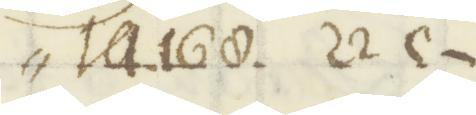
„ 14.168. 22 5
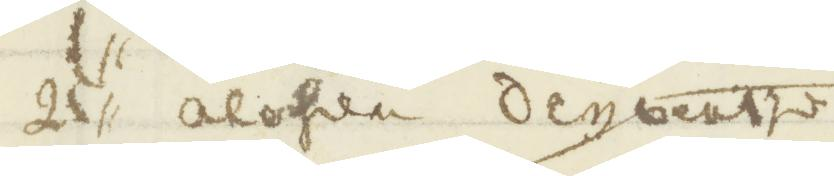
25„ alosen drijvertje
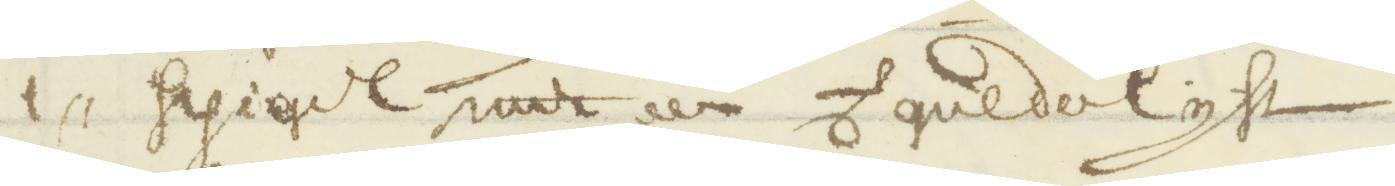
1„ spiegel met een vergulde lijst
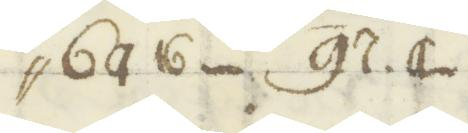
„6415 – 97. 4
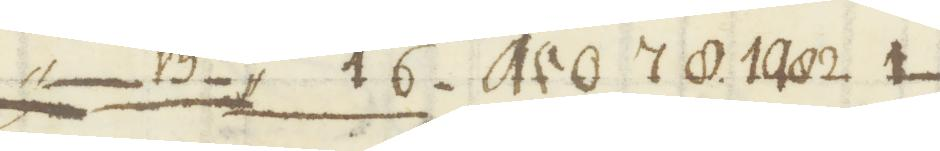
„ —13 – „ 16 - 450 7 8.1482 1
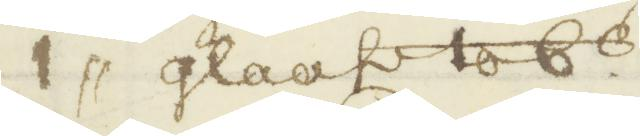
1„ glaase tob.s
